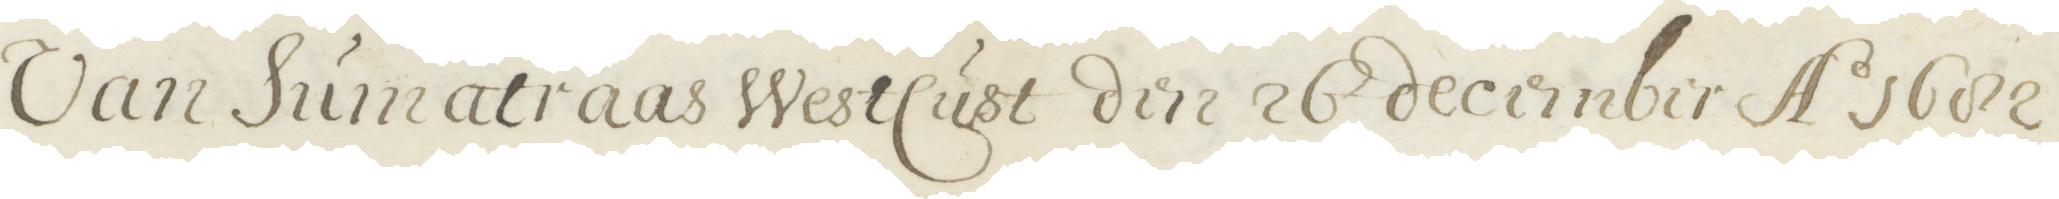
Van Sumatraas Westcust den 26 December Ao 1682
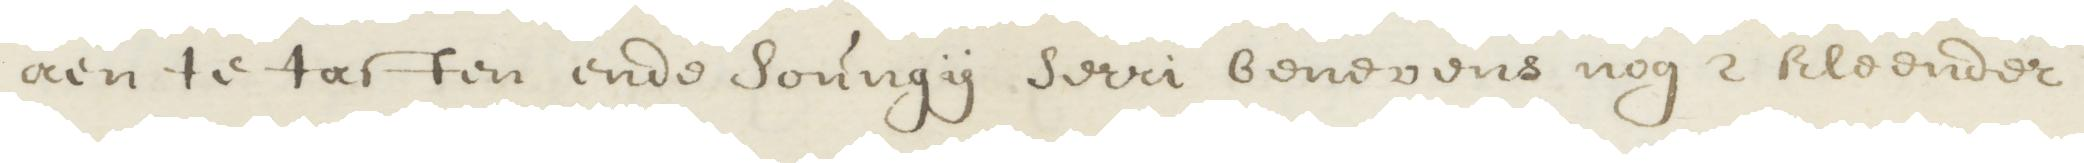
aen te tasten ende soungij serri benevens nog 2 kleender
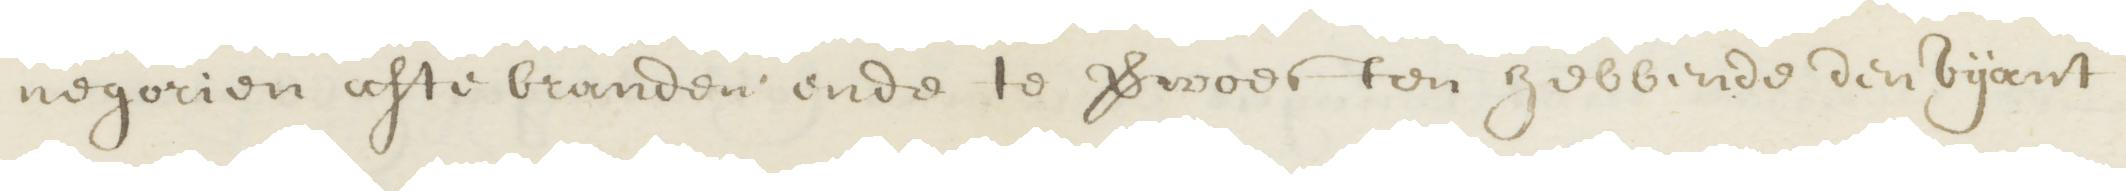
negorien afte branden ende te verwoesten hebbende den vijant
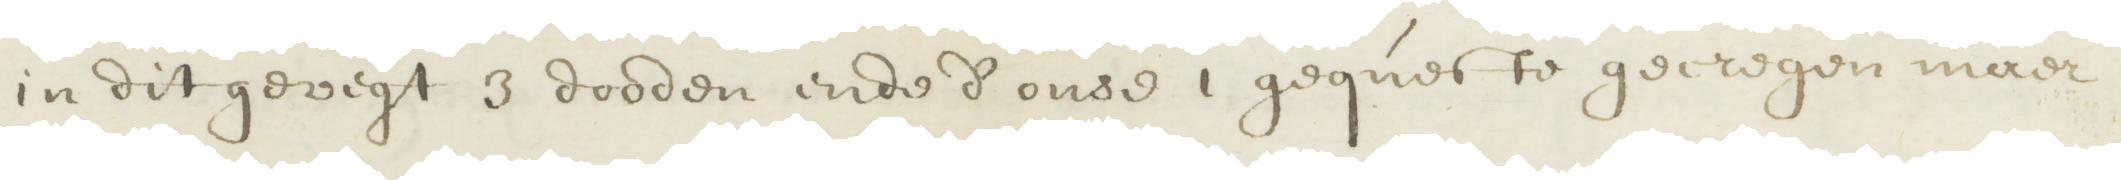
in dit gevegt 3 dooden ende d' onse 1 gequeste gecregen maer
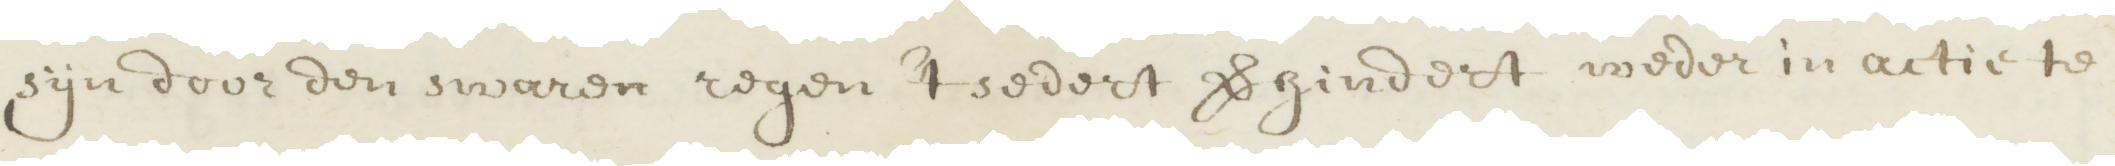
sijn door den swaren regen 't sedert verhindert weder in actie te
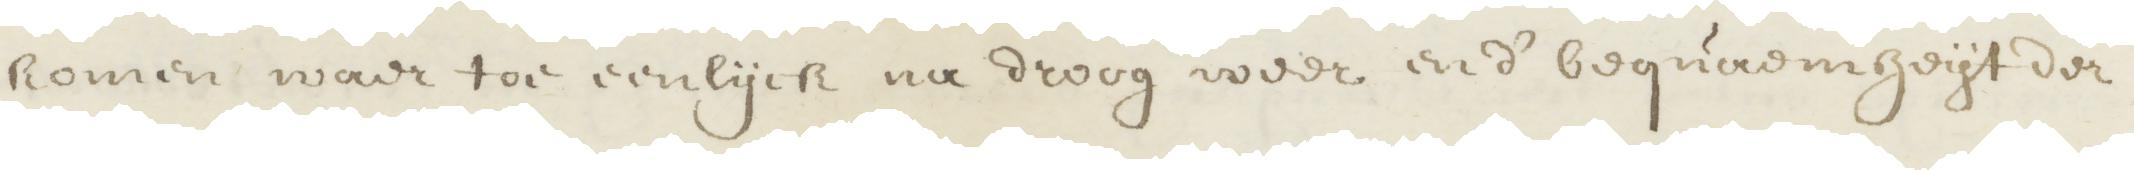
komen waer toe eenlijck na droog weer en d’ bequaemheijt der
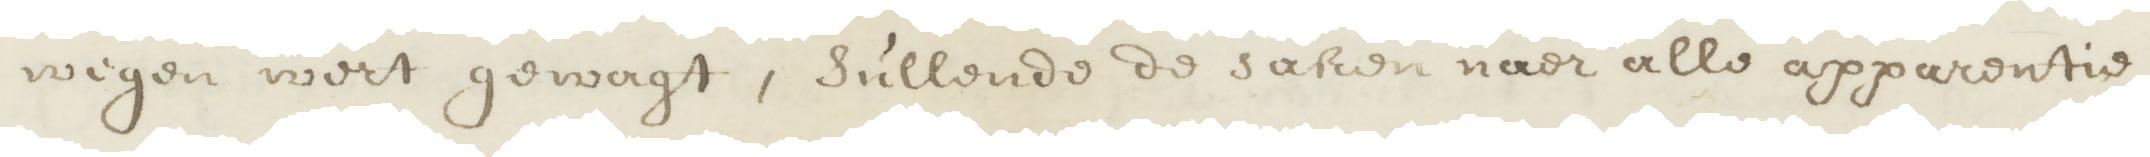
wegen wert gewagt, sullende de saken naer alle apparentie
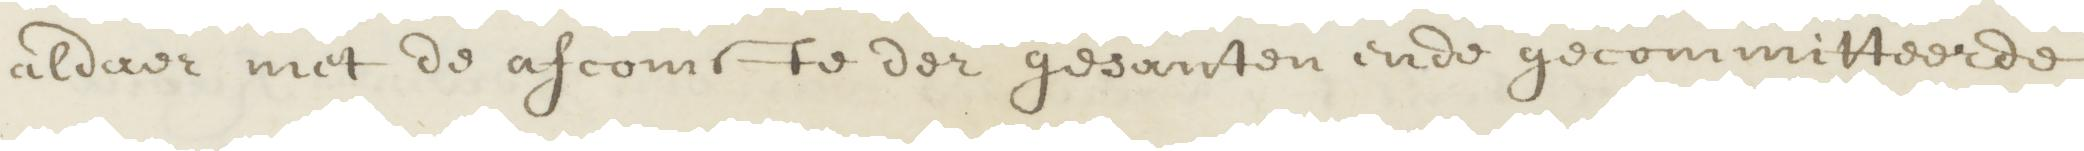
aldaer met de afcomste der gesanten ende gecommitteerde
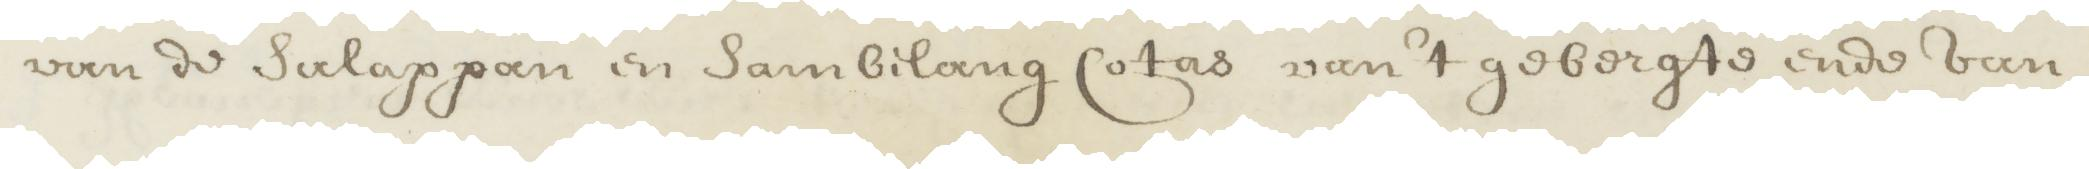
van de Salappan en Sambilang Cotas van ’t gebergte ende van
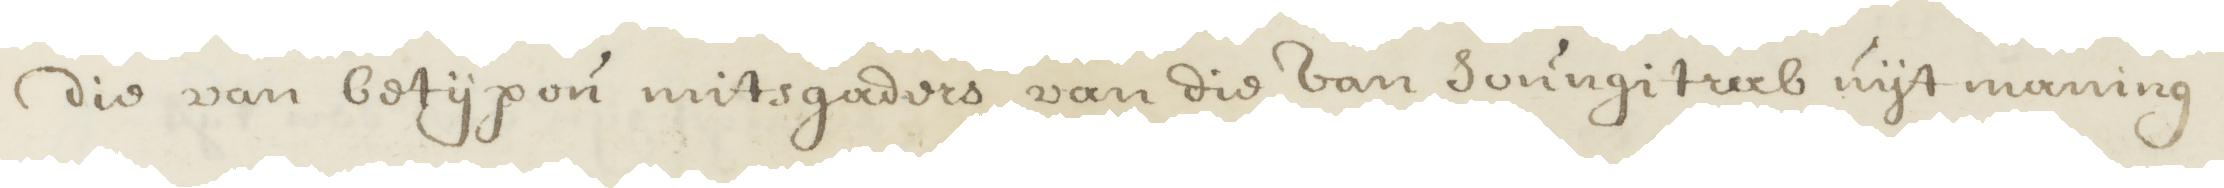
die van betijpou mitsgaders van die van soungitrab uijt maning
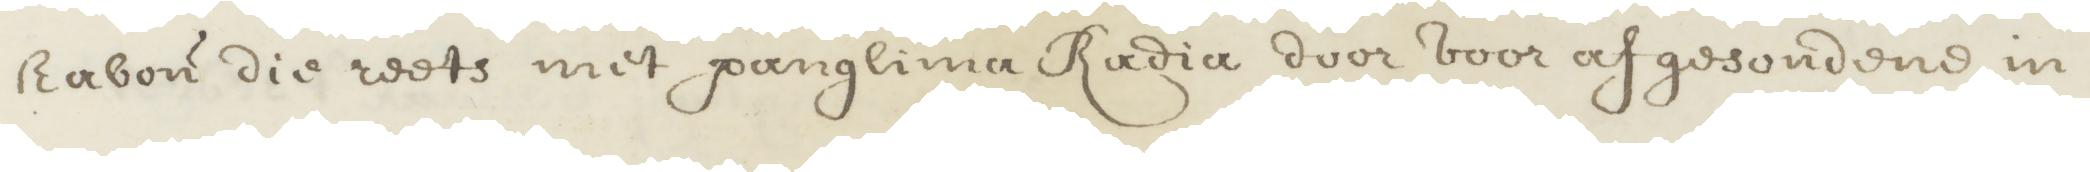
kabou die reets met panglima Radia door voor afgesondene in
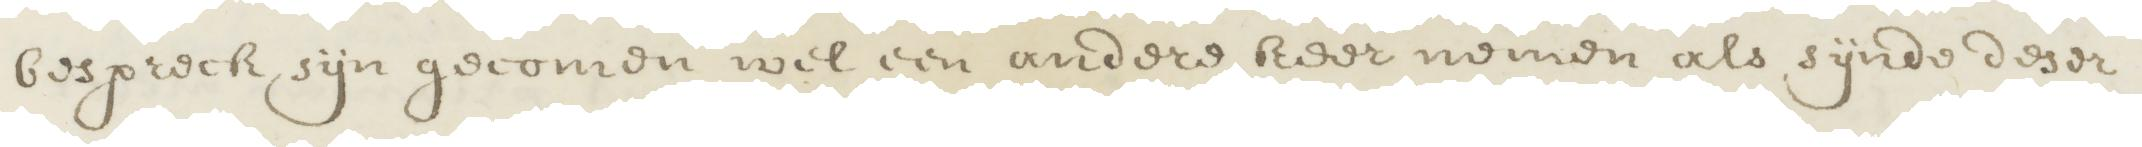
bespreck sijn gecomen wel een andere keer nemen als sijnde deser
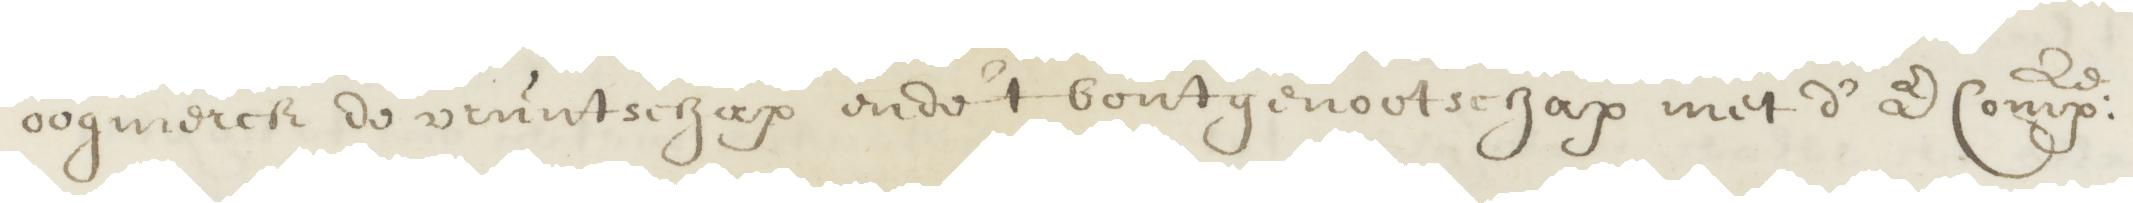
oogmerck de vruntschap ende ’t bontgenootschap met d’ E Comp:e
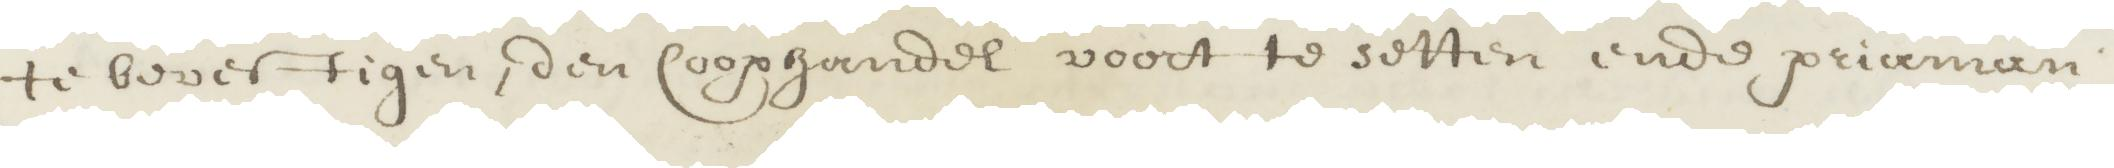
te bevestigen, den coopgandel voort te setten ende priaman
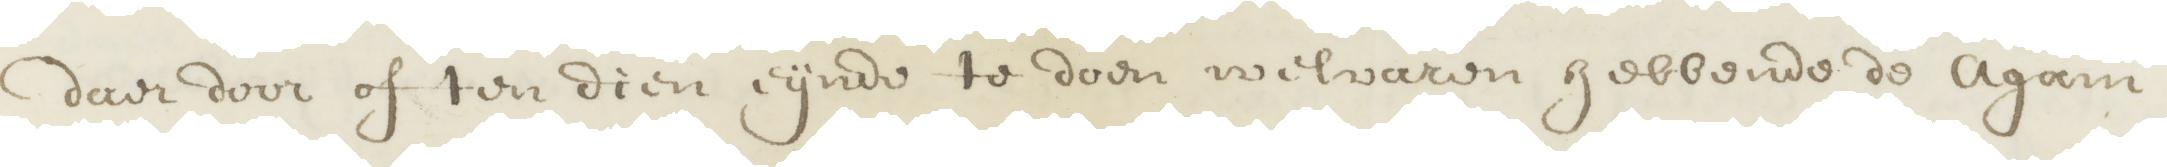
daer door of ten dien eijnde te doen welvaren hebbende de Agam
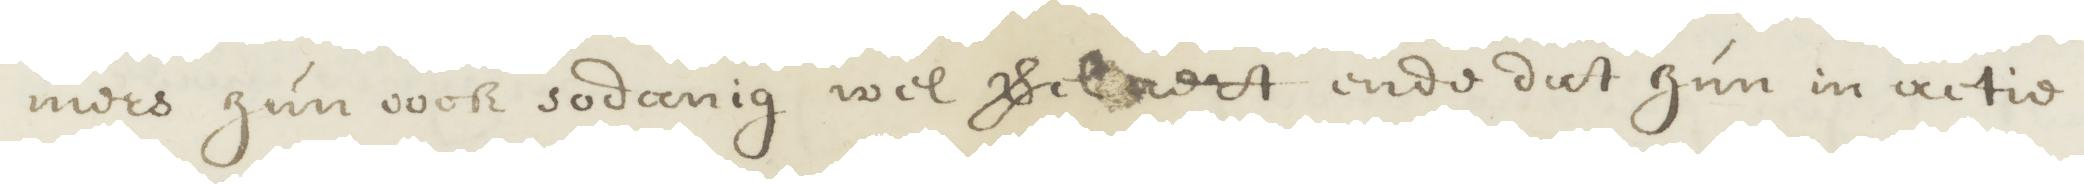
mers hun oock sodanig wel verclaert ende dat hun in actie
